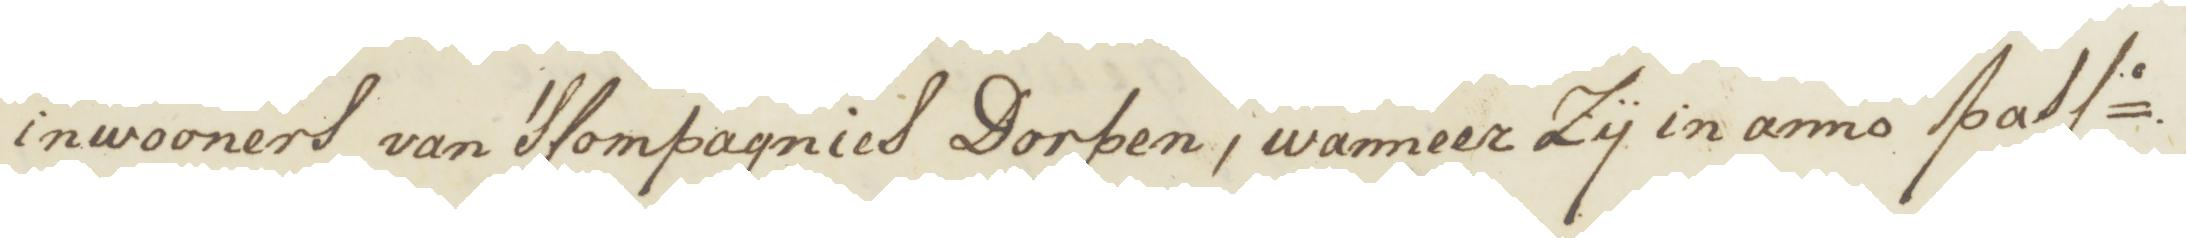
inwooners van 'S Compagnies Dorpen, wanneer Zij in anno pass=o
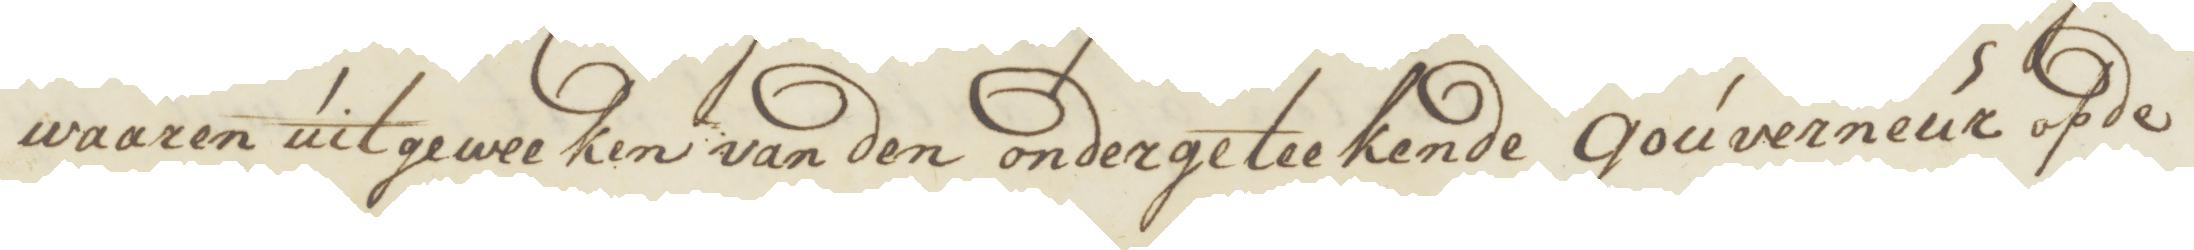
waaren uit geweeken van den ondergeteekende gouverneur op de
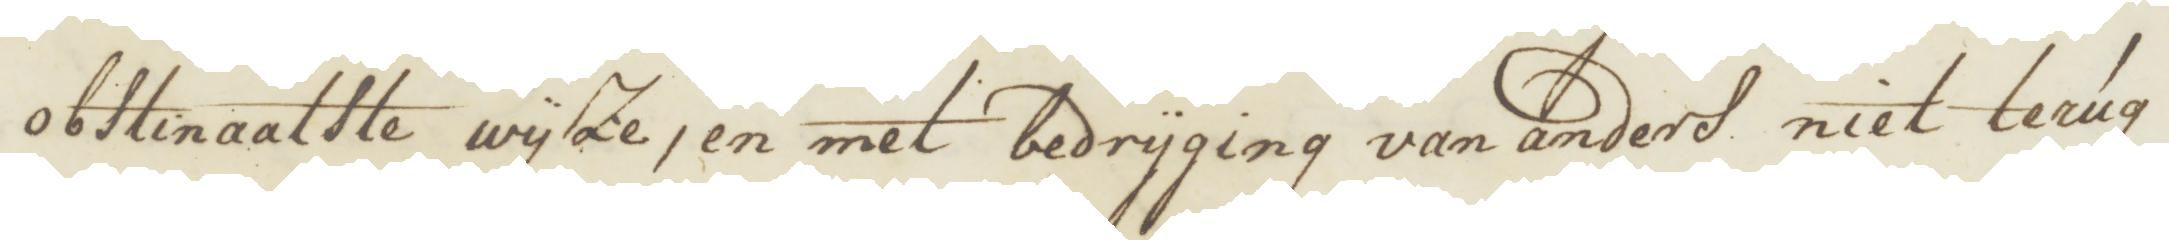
obstinaatste wijze, en met bedrijging van anders niet terug
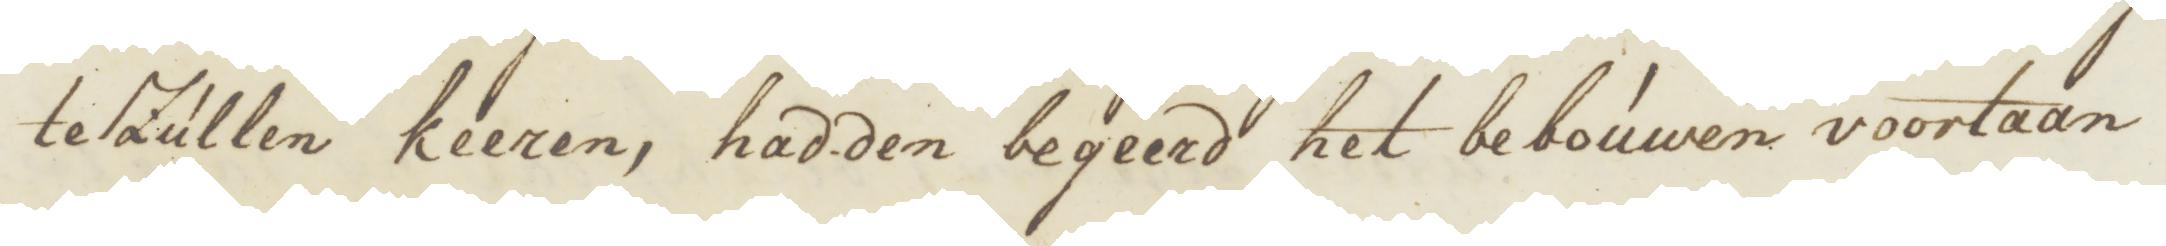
te Zullen keeren, hadden begeerd het bebouwen voortaan
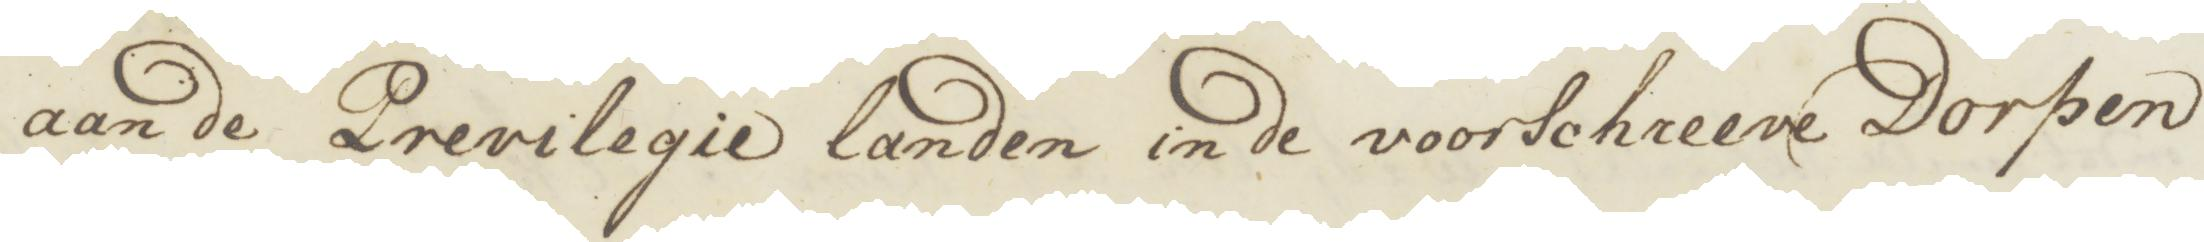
aan de Previlegie landen in de voorschreeve Dorpen
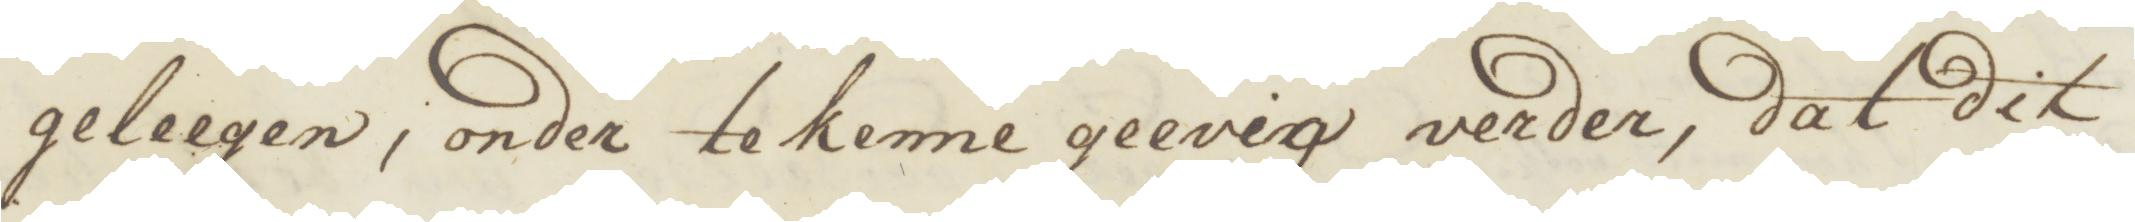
geleegen, onder te kenne geevig verder, dat dit
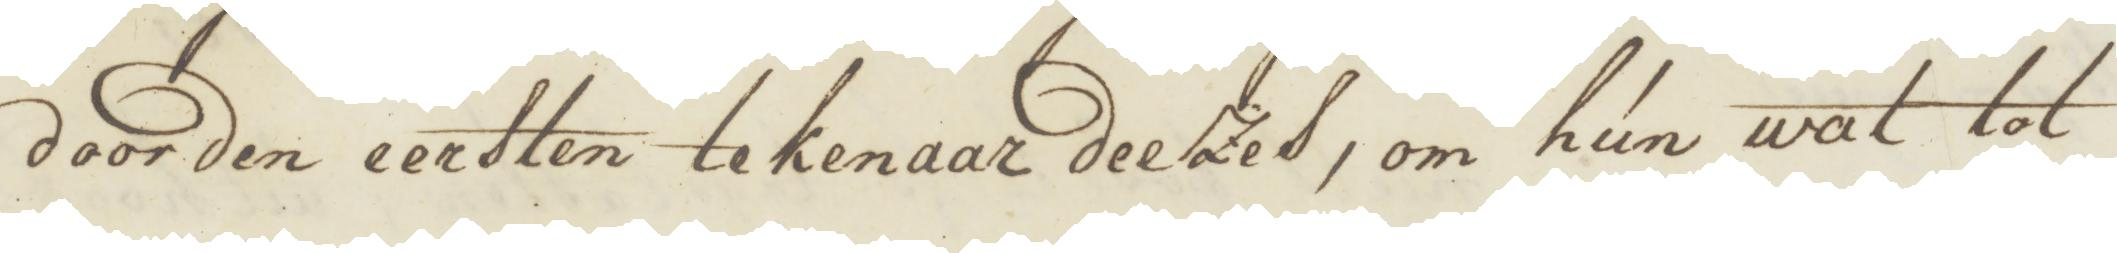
door den eersten tekenaar deezes, om hun wat tot
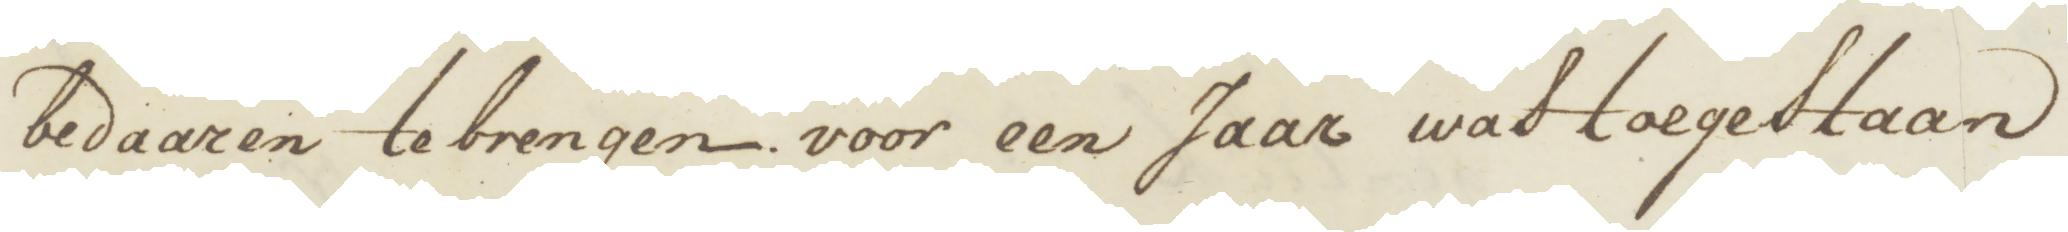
bedaaren te brengen. voor een Jaar was toegestaan
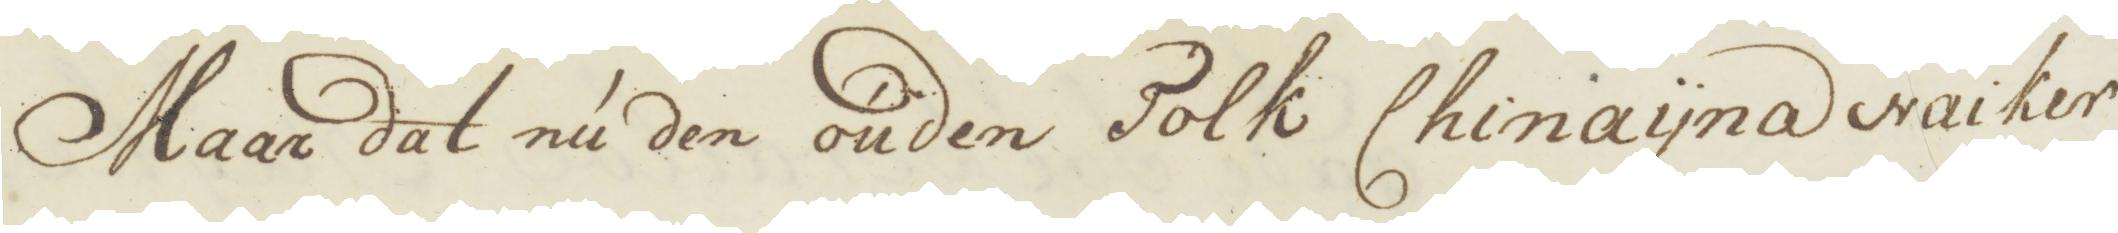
Maar dat nu den ouden Tolk Chinaijna naiker
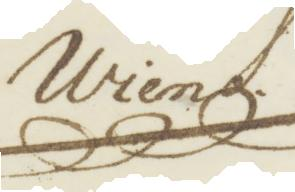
Wiens
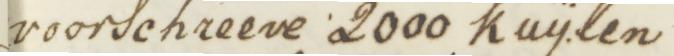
voorschreeve 2000 kuijlen
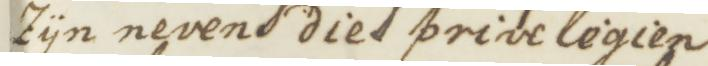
Zijn nevens dies privelegien
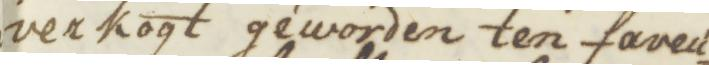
verkogt geworden ten faveu=
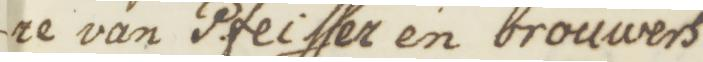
re van Pfeiffer en brouwers
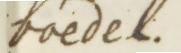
boedel.
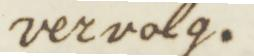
vervolg.
